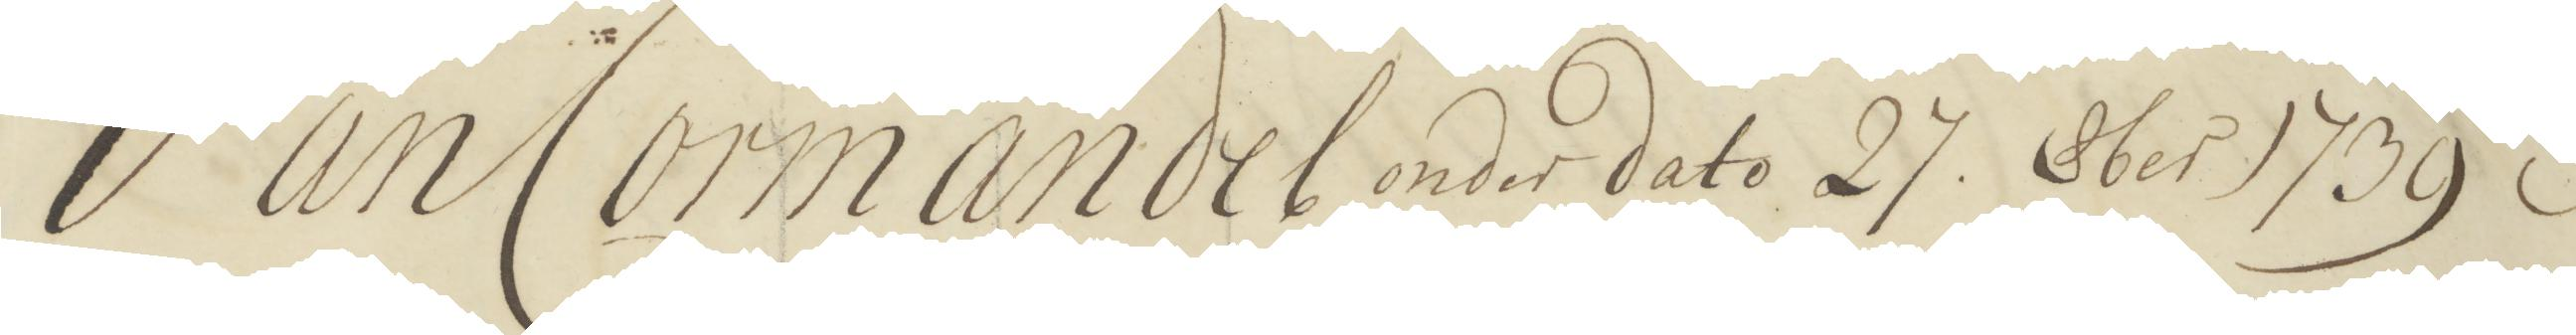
Van Cormandel onder dato 27. 8ber 1739
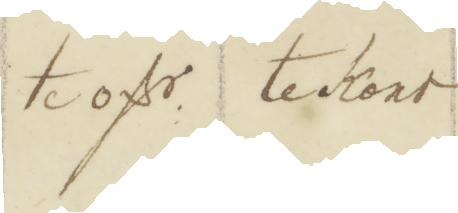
te overs. tekort
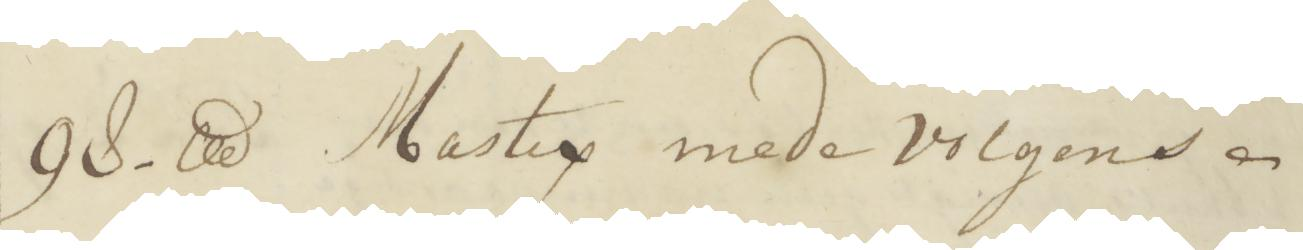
98. lb Mastix mede volgens ~
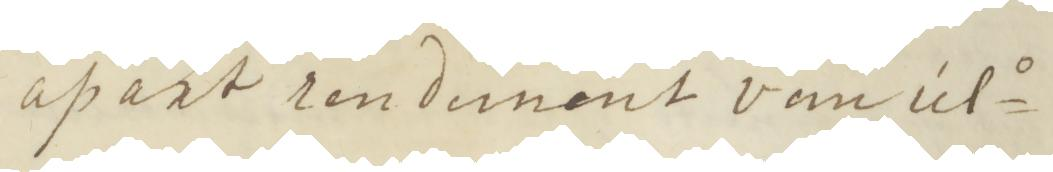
apart rendement van ut=o
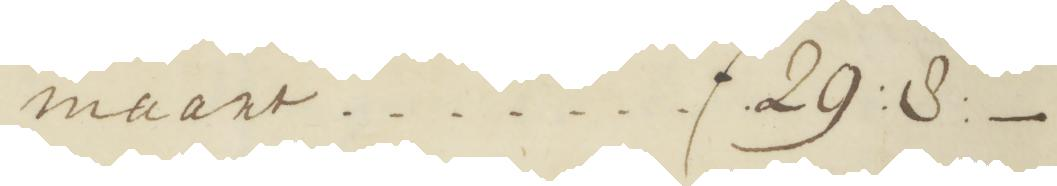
maart . . . . . . . ƒ. 29: 8: —
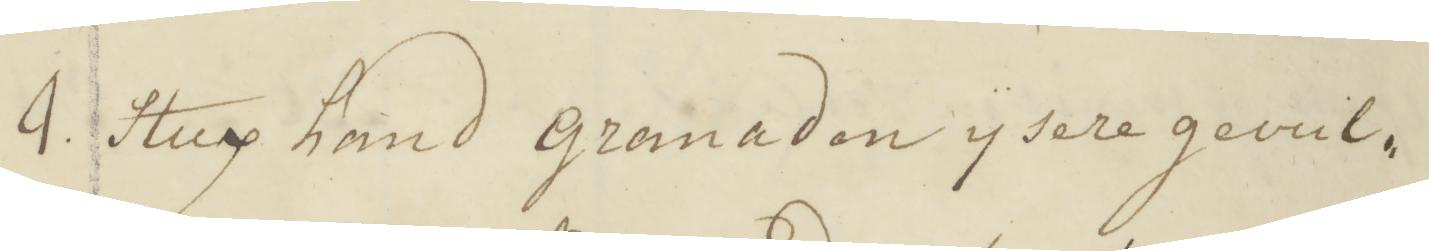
4. stux hand granaden ijsere gevul„
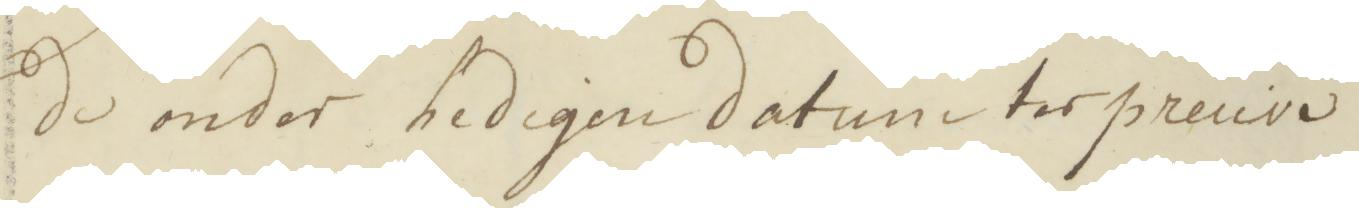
de onder hedigen datum ter preuve
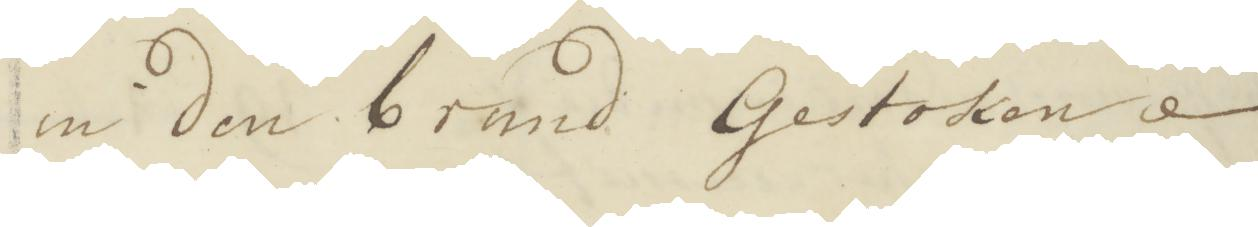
in den brand gestoken e
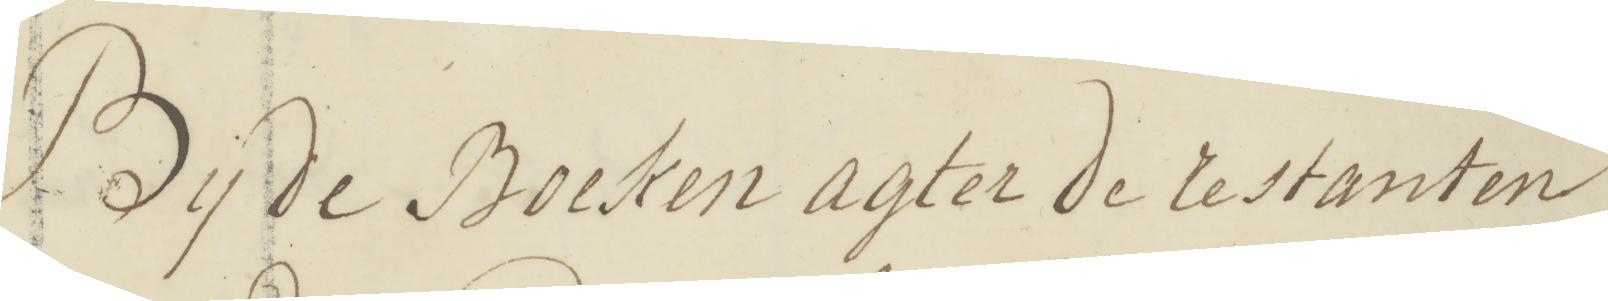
Bij de Boeken agter de restanten
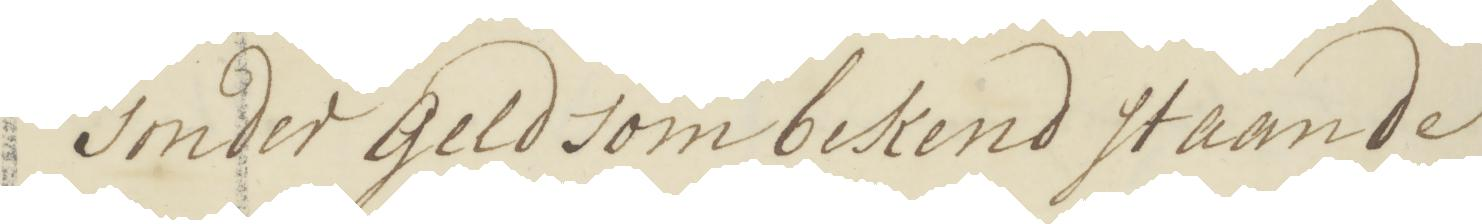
sonder geldsom bekend staande,
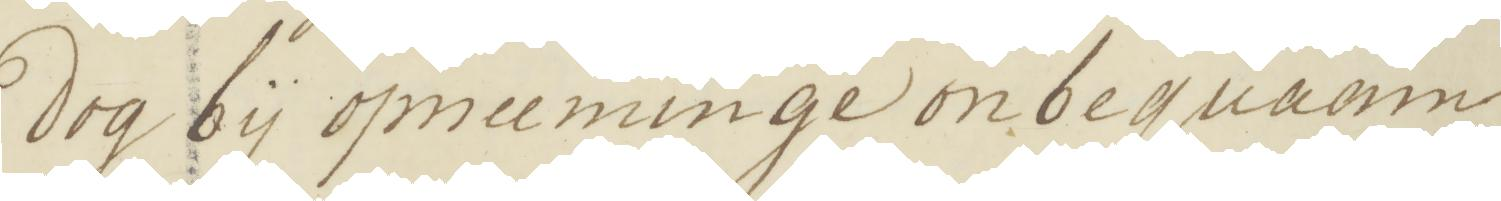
dog bij opneeminge onbequaam
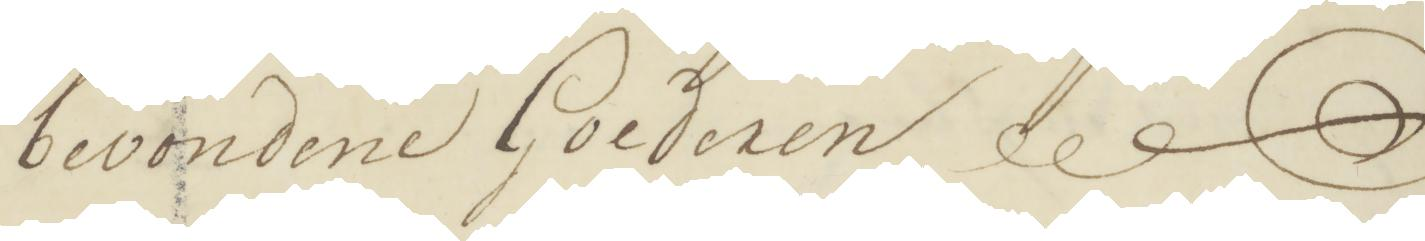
bevondene Goederen
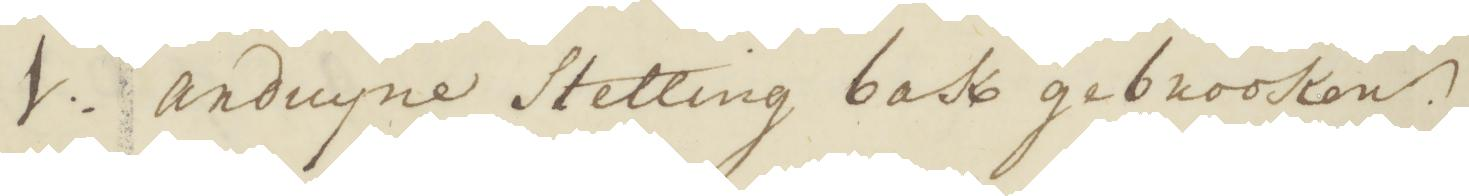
1: arduyne stelling bak gebrooken
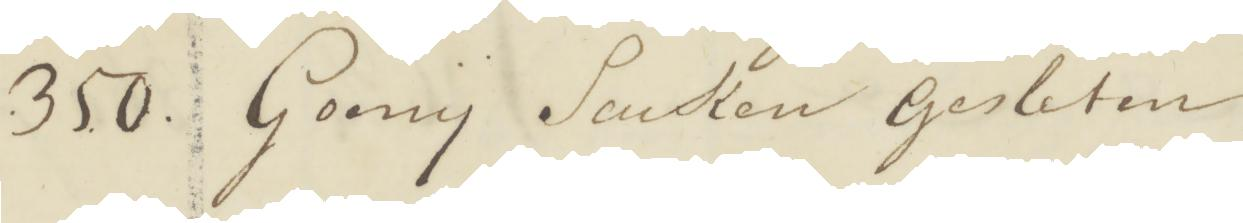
350. Goenij Sacken gesleten
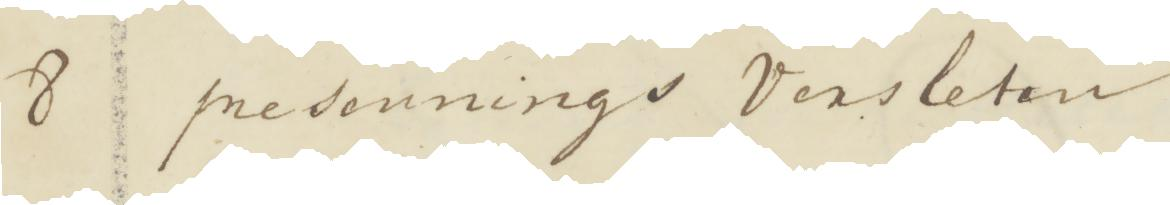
8 presennings Versleten
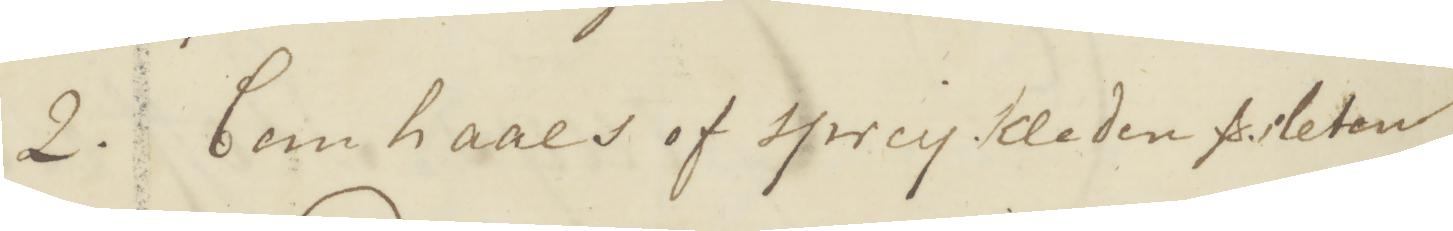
2. bemhaals of spreij kleden versleten
